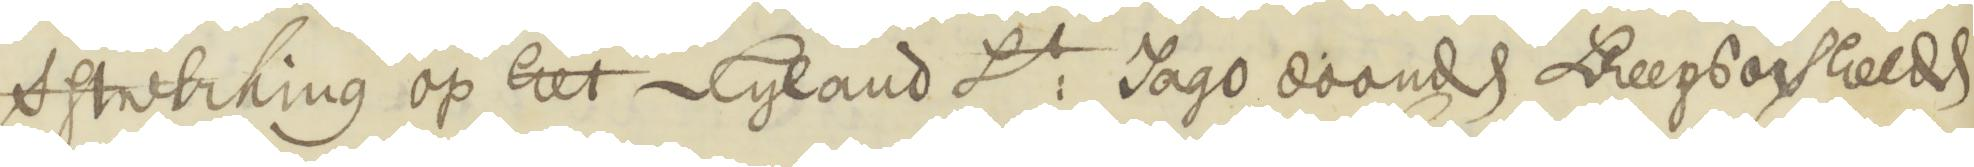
verstrekking op het Eyland s:t Iago door den scheepsoverheeden
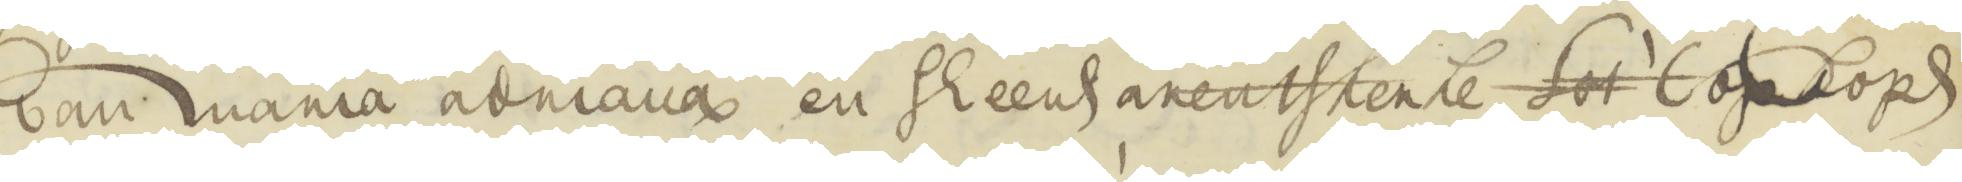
van maria adriana en sheeren arentskerke tot ’t op kopen
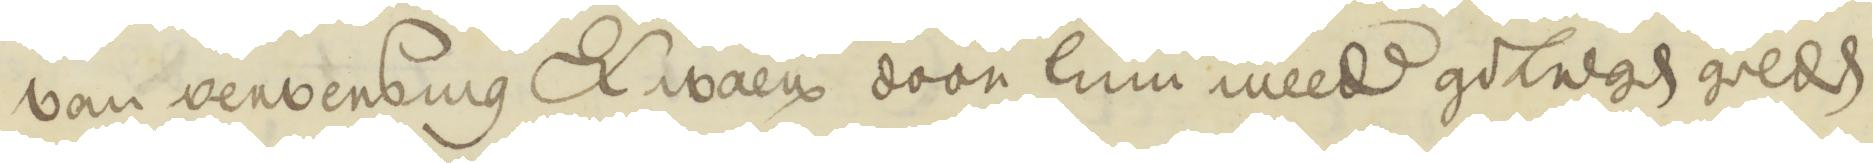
van verversing &' waer door hun meede gekregen gelden
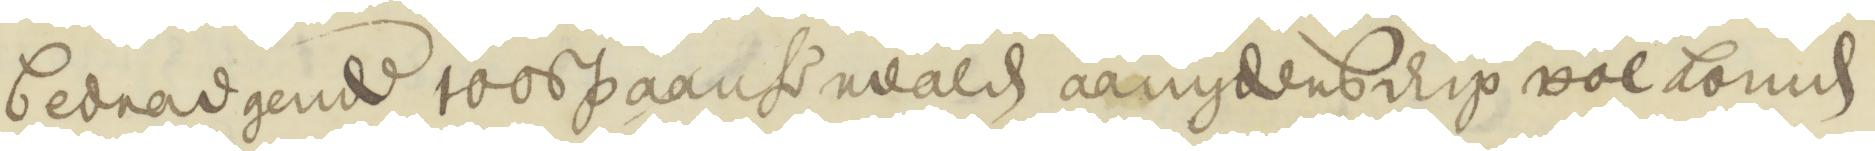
bedraegende 100 spaanse realen aan ijder schip volkomen
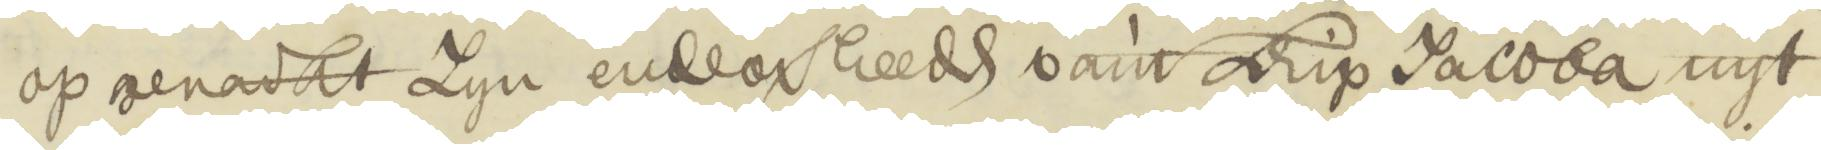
op geraekt Zyn ende overheeden van't schip Iacoba uyt
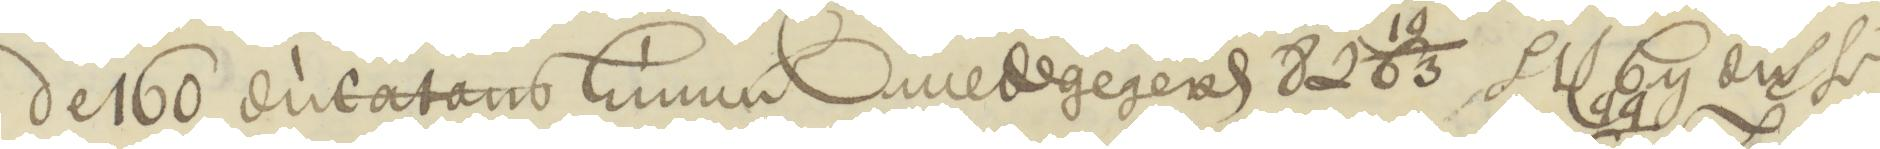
de 160 ducatons hunne medegegeven 82 19/63 SW. by diverse
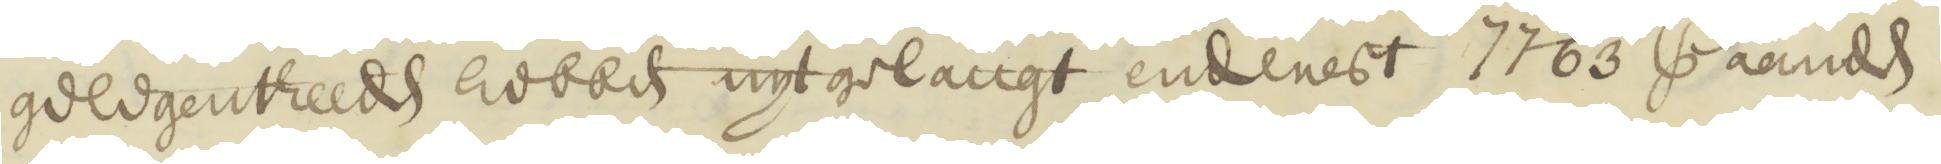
gelegentheeden hebben uytgelangt en de rest 77 44/63 p:s aanden
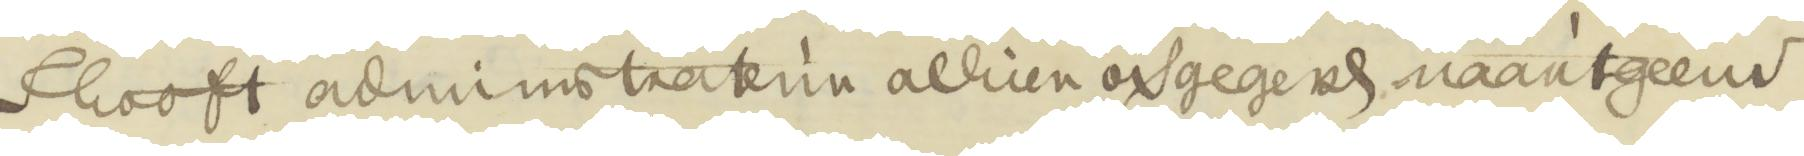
E hooft administrateur alhier overgegeven naar 't geene
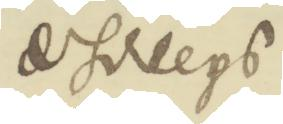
de scheeps
